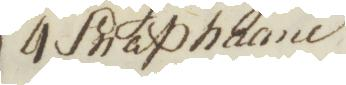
4 Snaphaane
